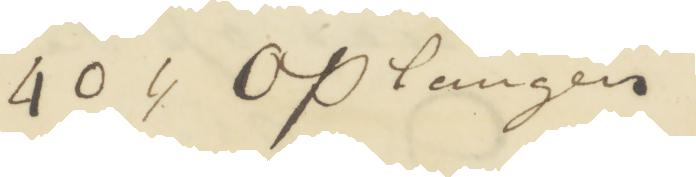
40 „ Oplangen
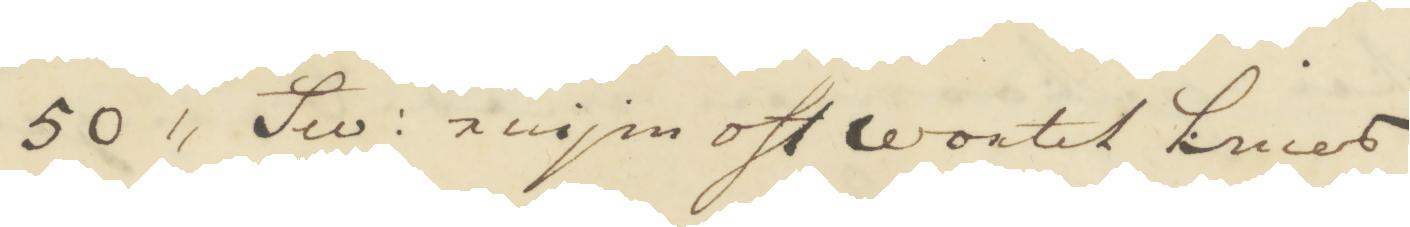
50 „ Sw: ruijm oft wortel knies
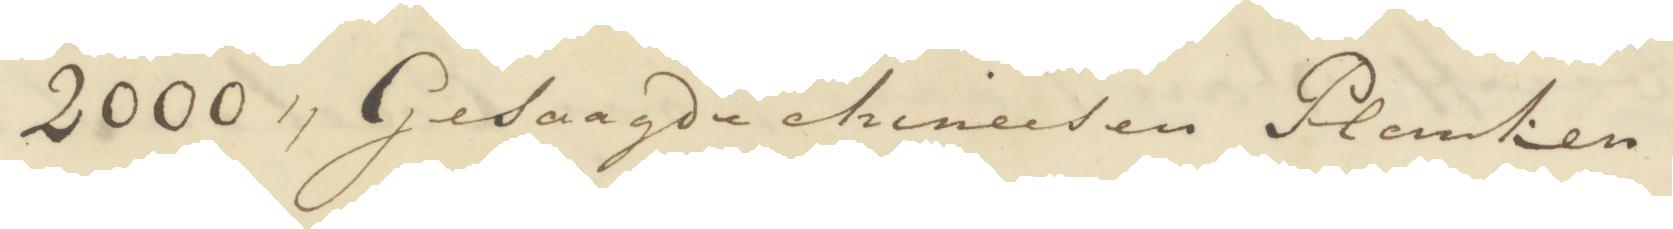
2000 „ Gesaagde chineesen Planken
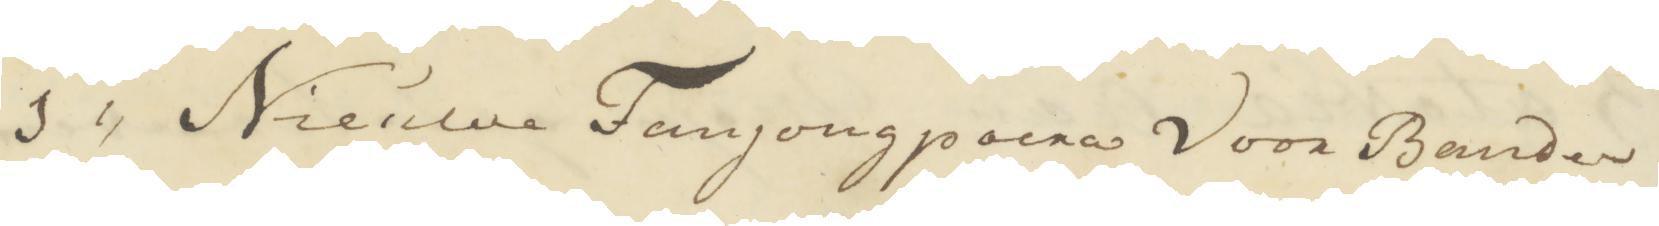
1 „ Nieuwe Tanjongpoera voor Bander
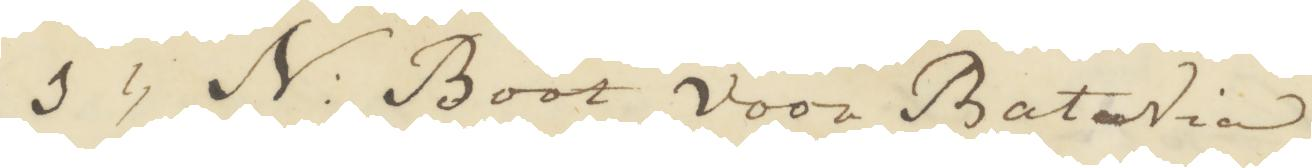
1 „ N: Boot voor Batavia
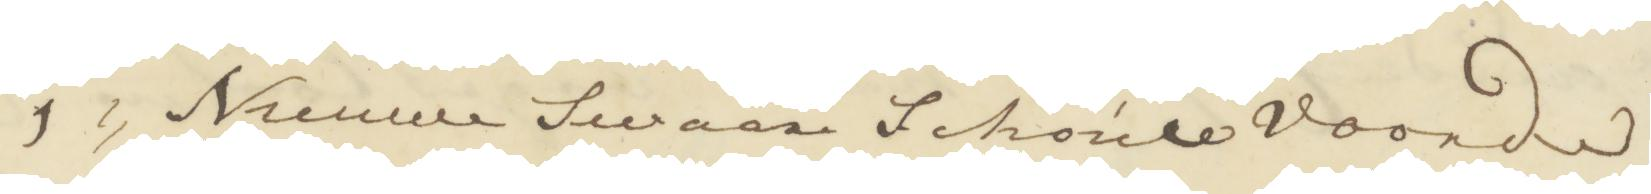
1 „ Nieuwe swaare schouw voorde
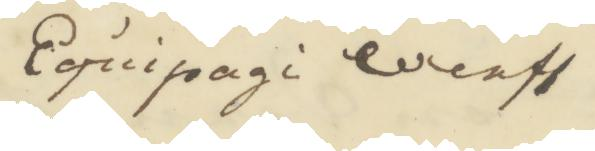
Equipagi werft
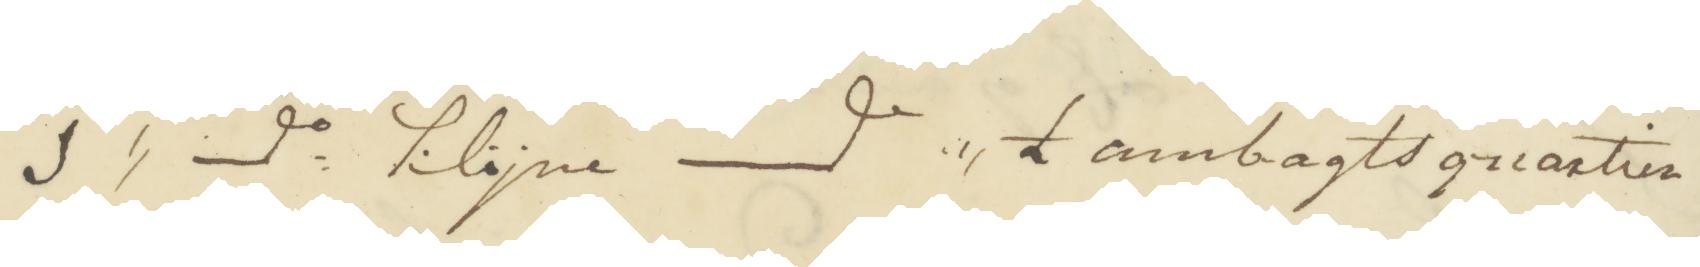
1 „ _:o klijne _:o „ t ambagts quartier
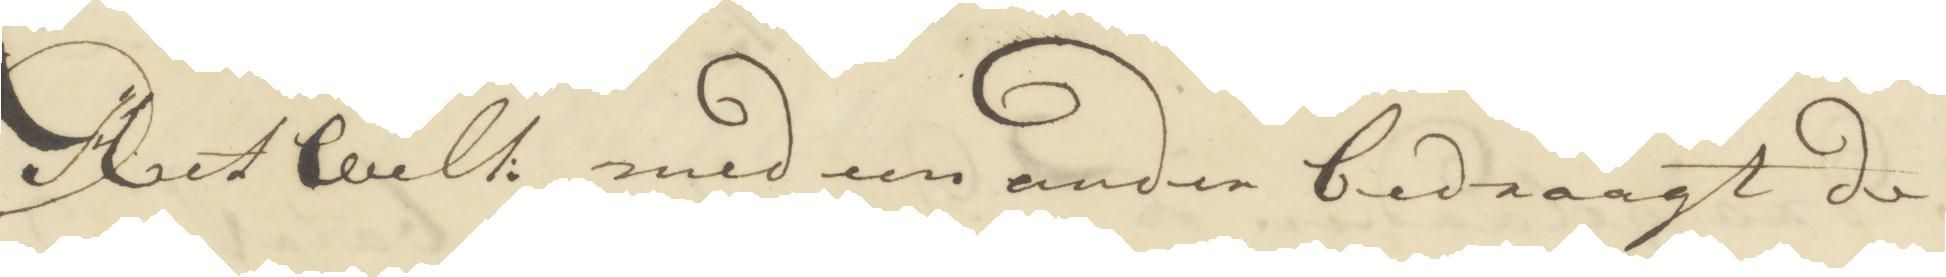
Het welk med een ander bedraagt de
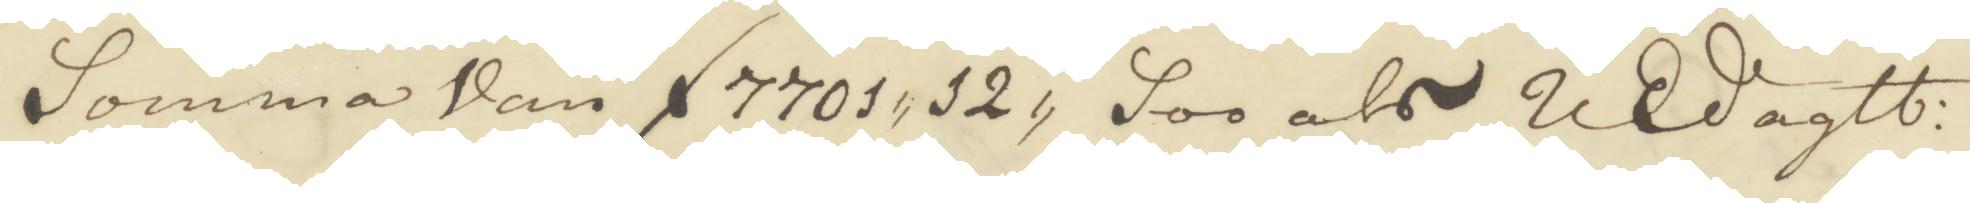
somma van ƒ 7701„12„ soo als uEd agtb:
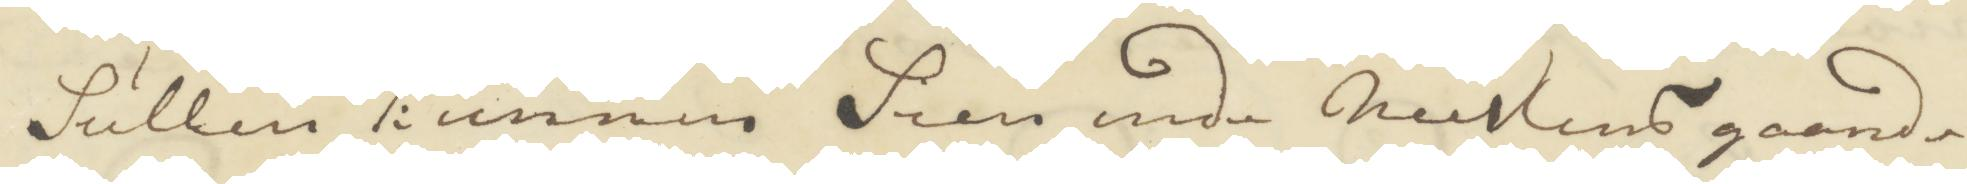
sullen kunnen sien inde neevens gaande
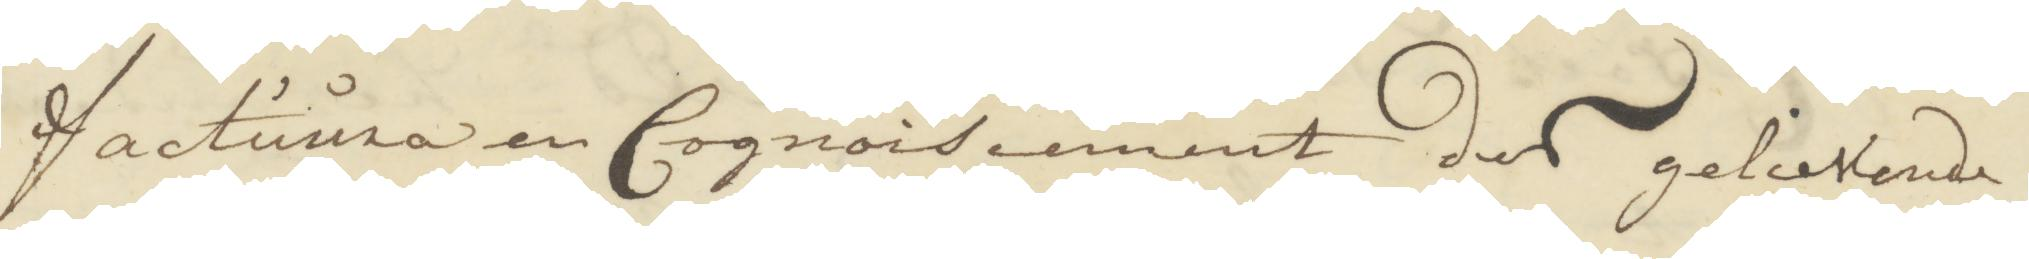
factuura en Cognoiscement des gelievende
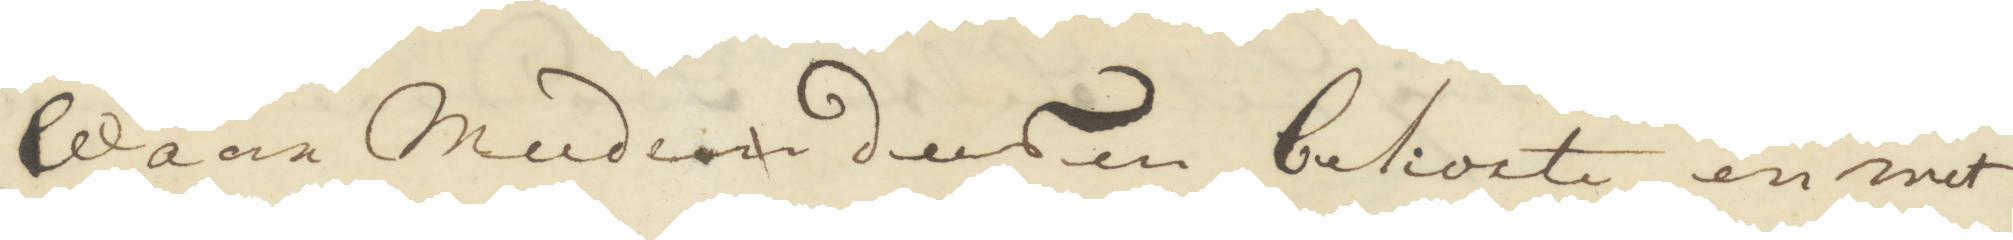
waar meeden deesen bekorte en met
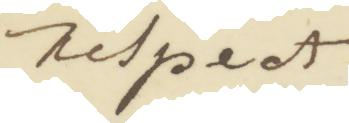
respect
